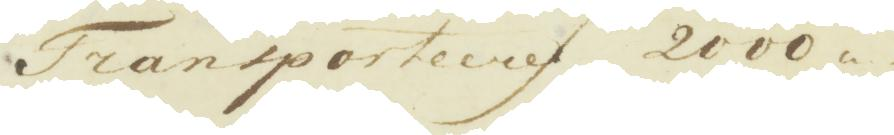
Transporteereƒ 2000 „
